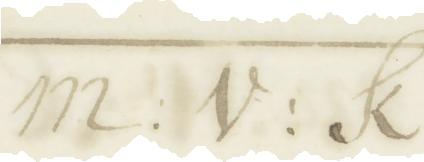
m: v: k
